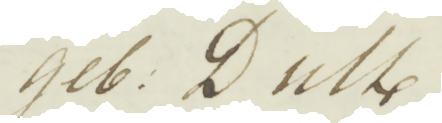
geb. D ulk
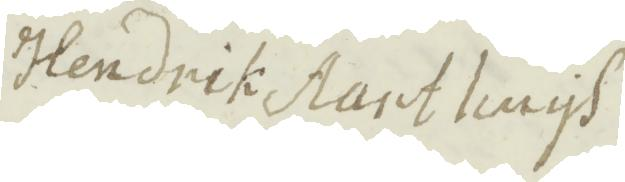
Hendrik Aart kruis
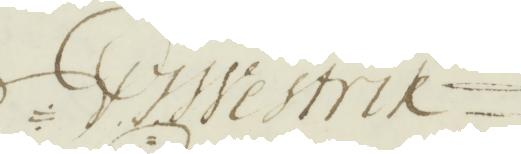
P.I.Westrik
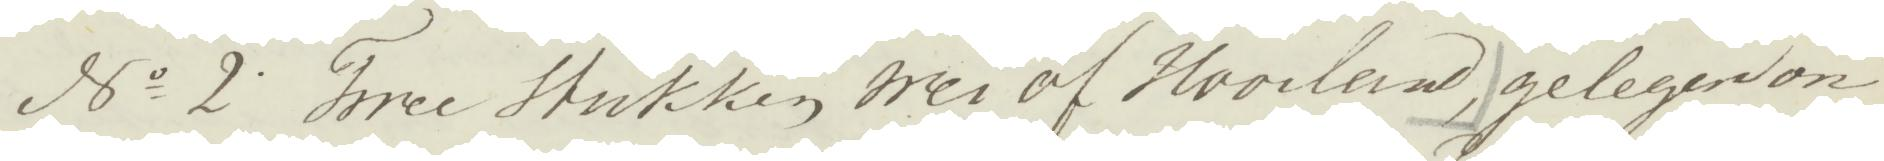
N:o 2. Twee stukken wei of Hooiland, gelegen on
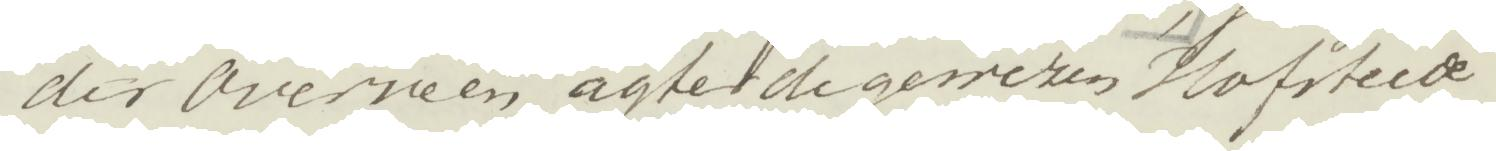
der Overveen agter de gewezen Hofsteede
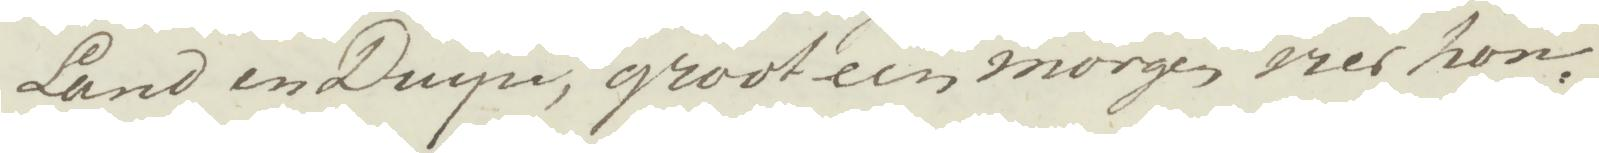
Land en Duijn, groot een morgen vier hon„
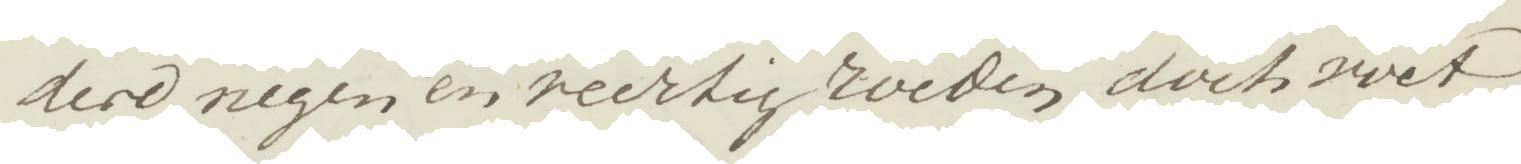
derd negen en veertig roeden doch voet
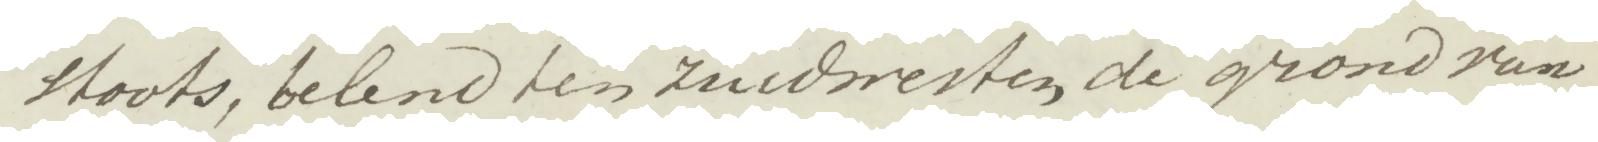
stoots, belend ten zuidwesten de grond van
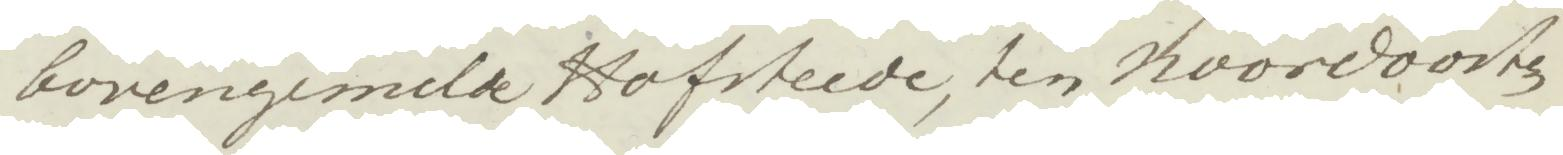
bovengemelde Hofsteede, ten Noordoosten
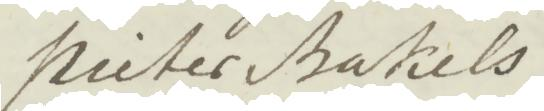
Pieter Bakels
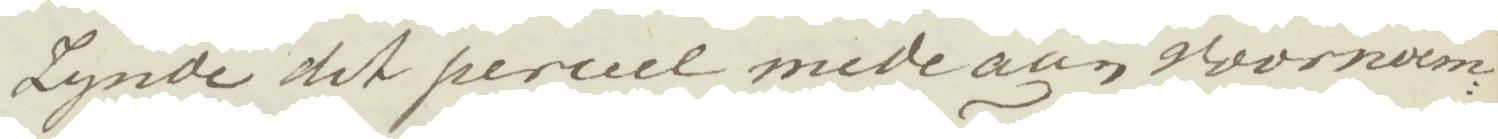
Zynde dit perceel mede aan voornoem:
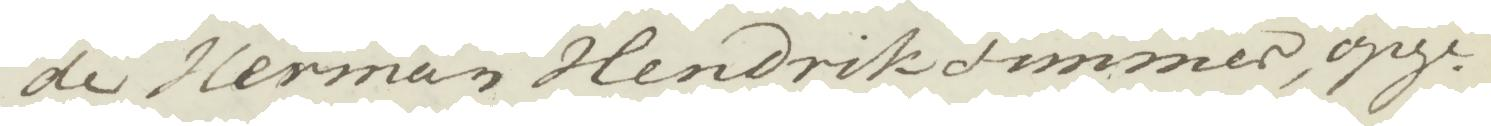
de Herman Hendrik Timmer, opge.
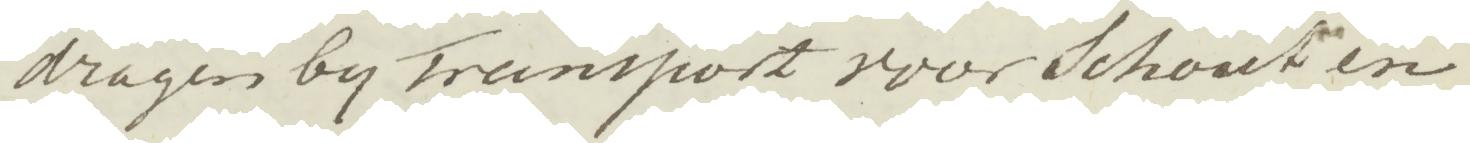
aragen by Transport voor schout en
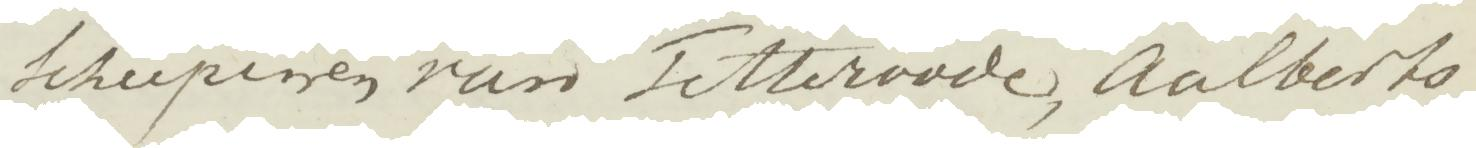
scheepenen van Tetteroode, Aalberts
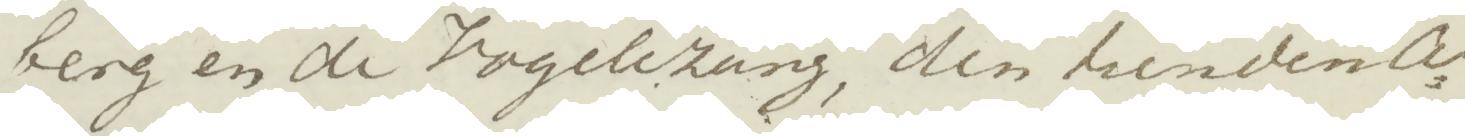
kerg en de Vogelezang, den tienden A=
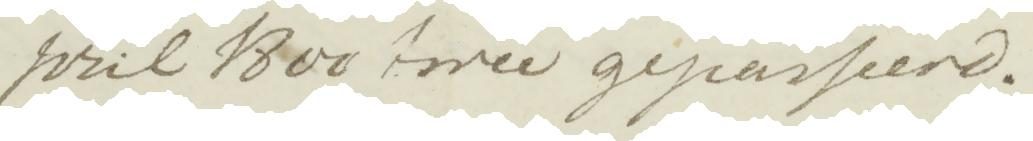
pril 1800 twee gepasseerd.
